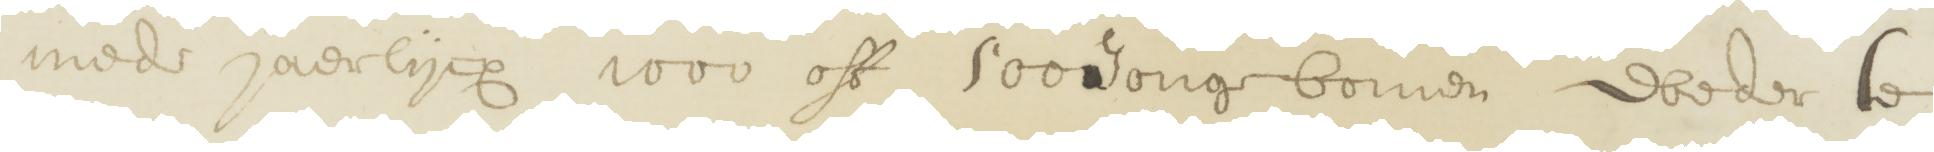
mede jaerlijcx 1000 off 500 Jonge bomen weder te
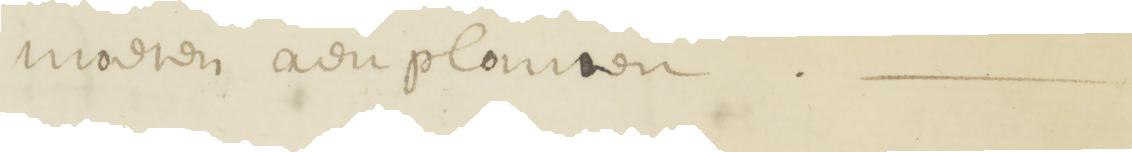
moeten aen planten. —
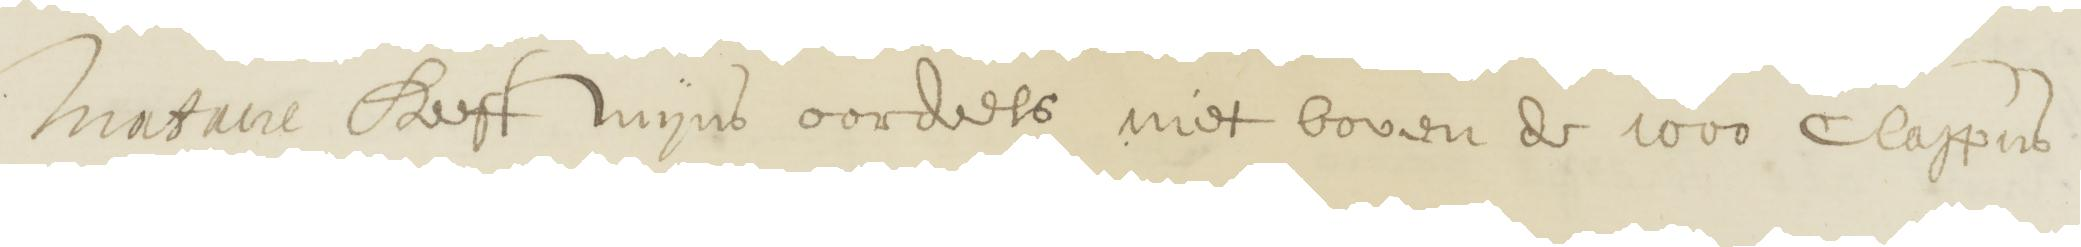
Matane heeft mijns oordeels niet boven de 1000 clappus
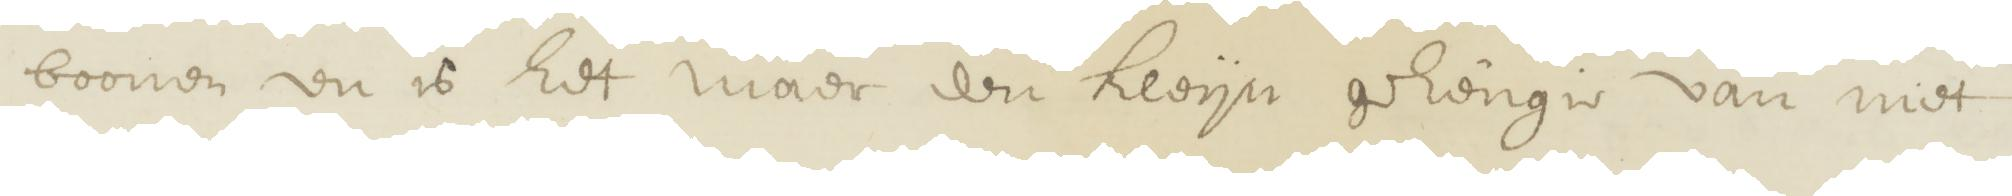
boomen en is het maer een kleijn geheugie van niet
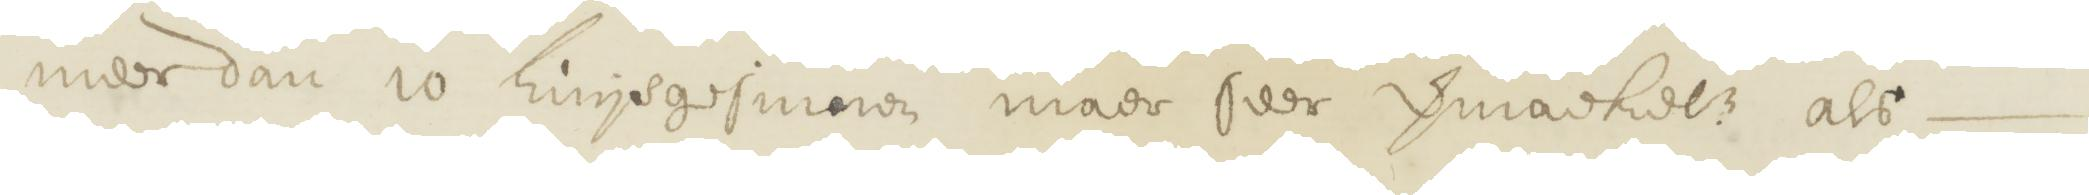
meer dan 10 huijsgesinnen maer seer vermaekelijk als —
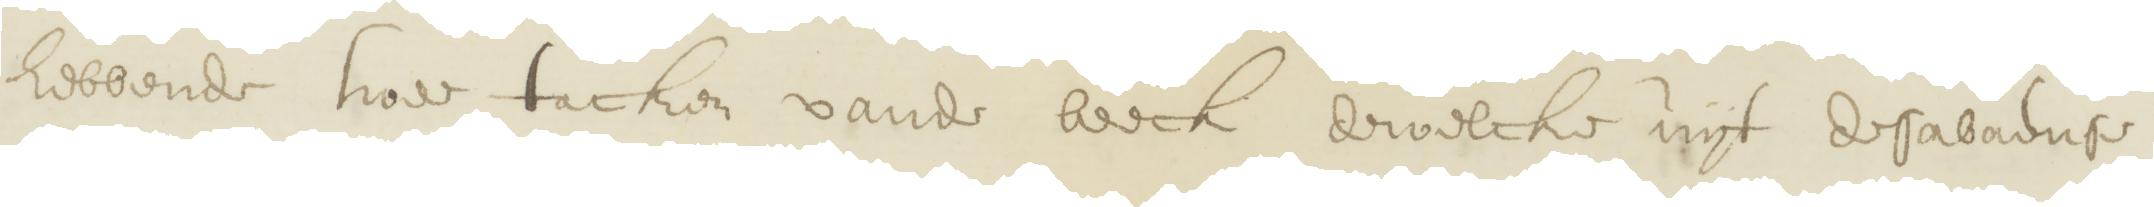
hebbende twee tacken vande beeck dewelcke uijt de sabaense
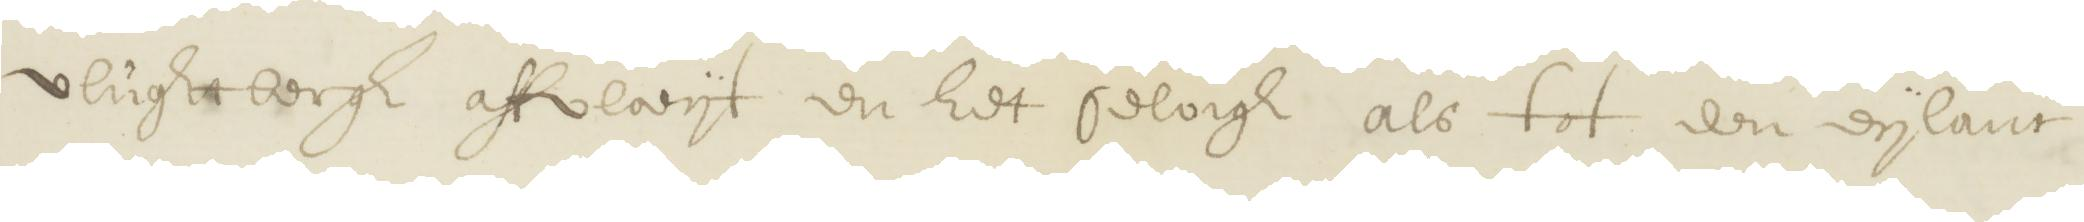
vlughtbergh affvloeijt en het selvigh als tot een eijlant
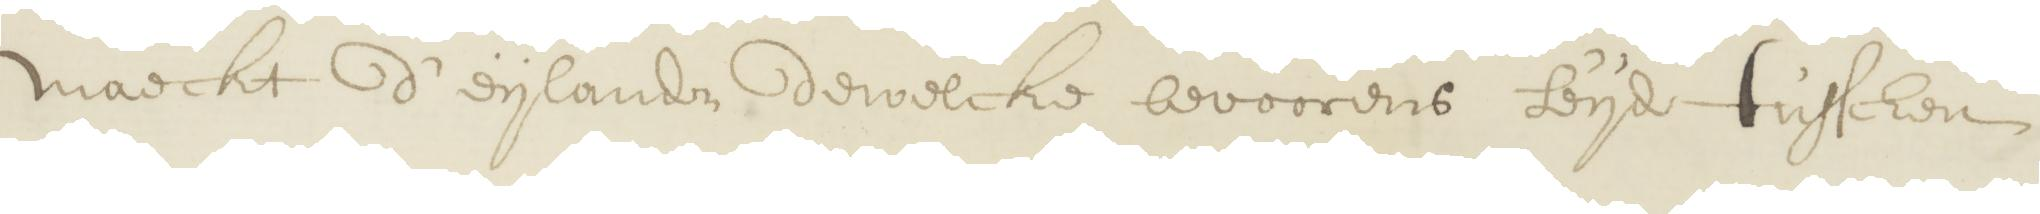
maeckt d’ eijlanden dewelcke bevoorens seijde tusschen
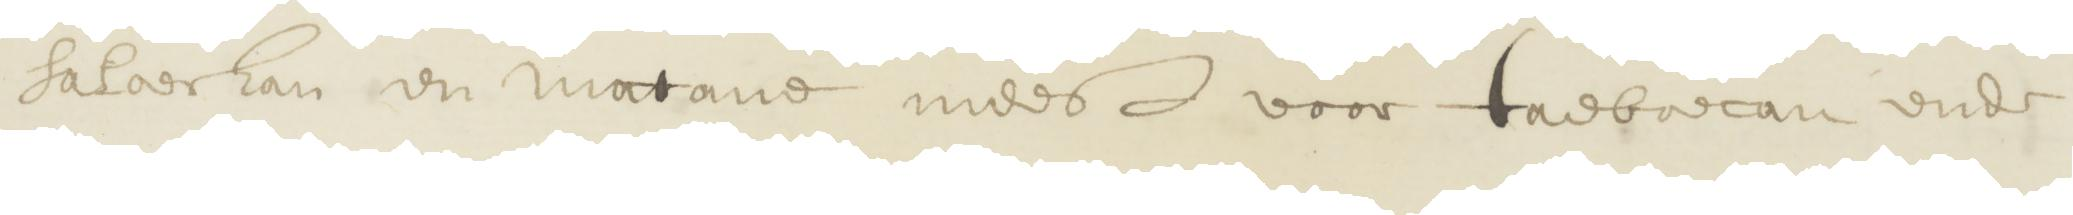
saloerhan en matane meest voor treboecan ende
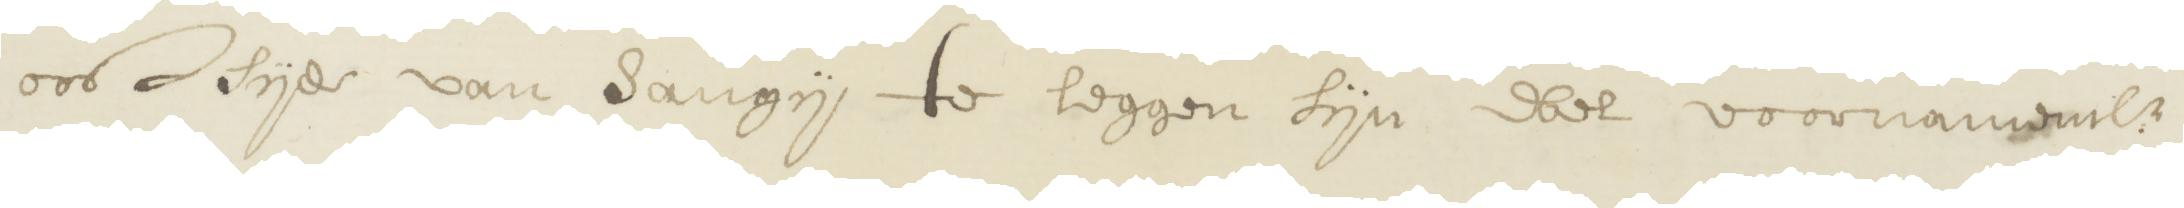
oost sijde van sangij te leggen sijn wel voornamentlijk
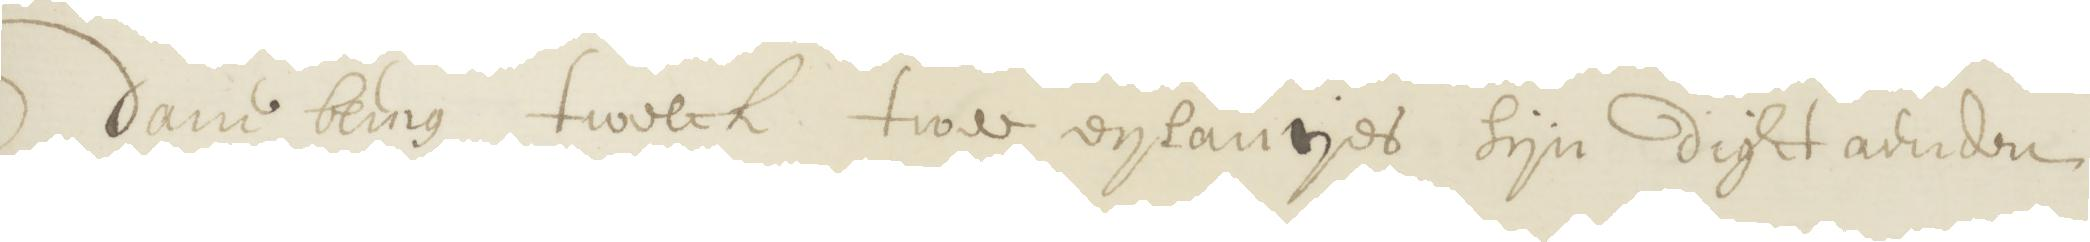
dane beeng twelck twee eijlantjes sijn dight aenden
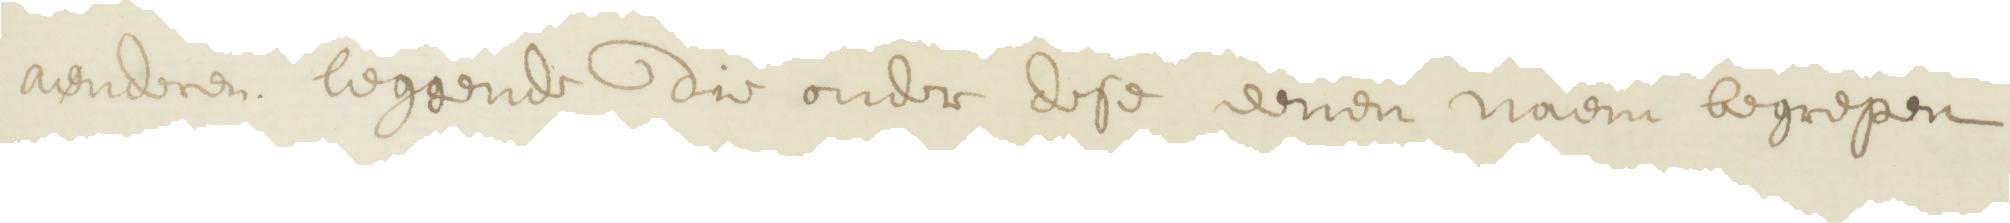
aenderen. leggende die onder dese eenen naem begrepen
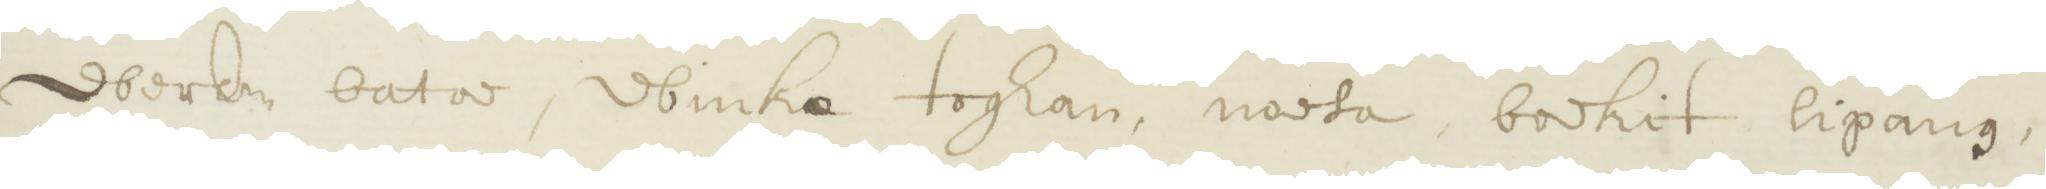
werden batoe, winka toghan, noesa boekit lipang,
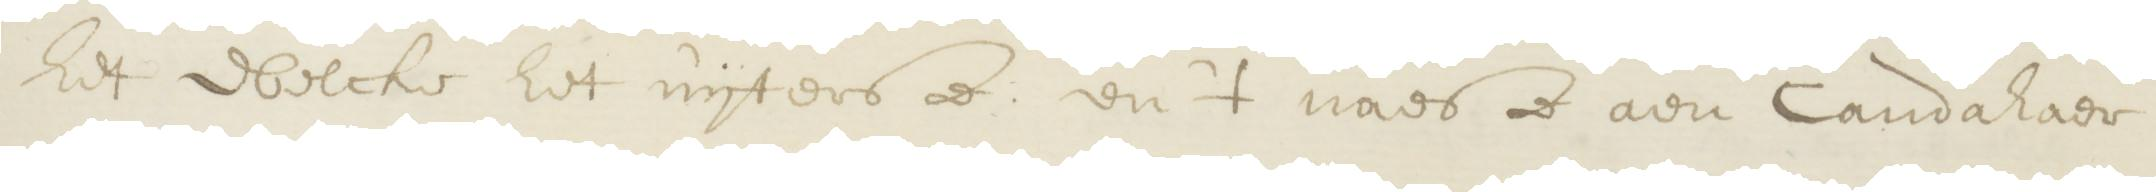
het welcke het uijterste. en ’t naeste aen Candahaer
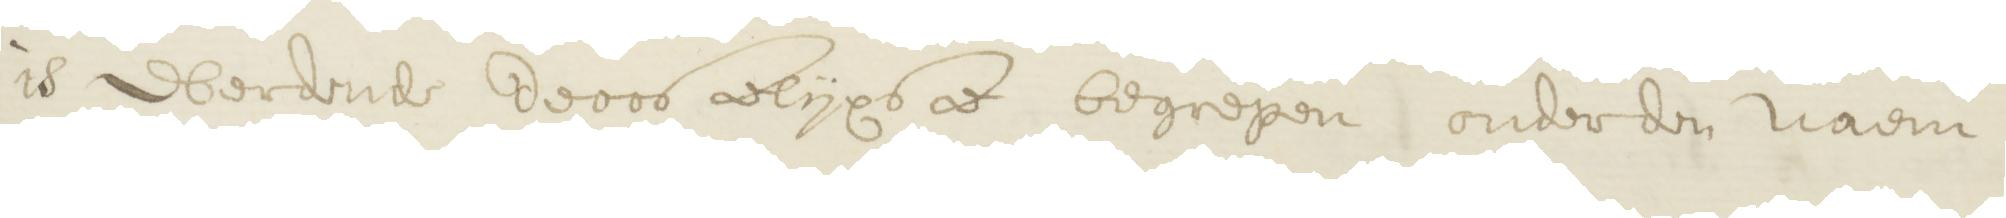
is werdende de oostelijxste begrepen onder den naem
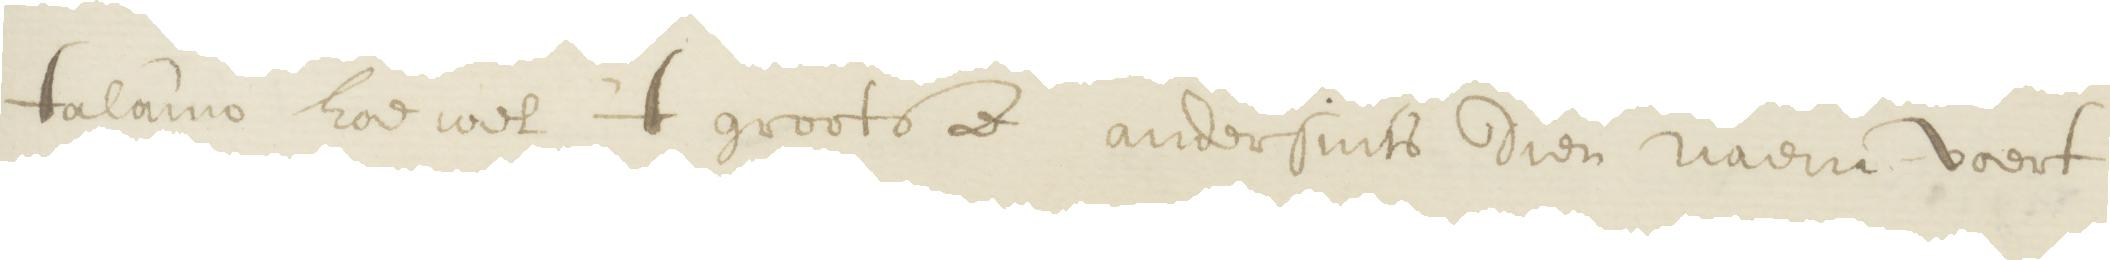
talauw hoe wel ’t grootste andersints dien naem voert
